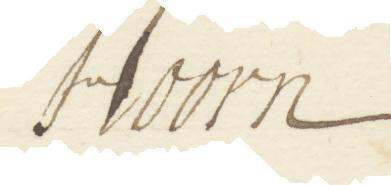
Hoorn
